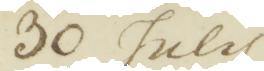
30 Julij
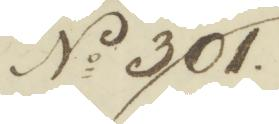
N:o 301.
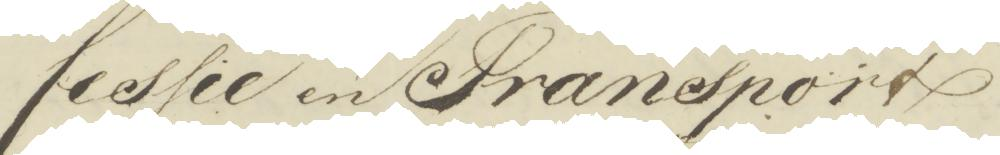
Cessie en Transport
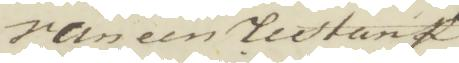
van een restant
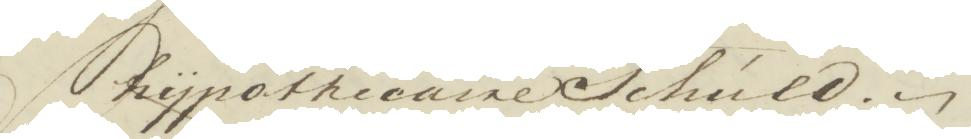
hijpothecaire Schuld. —
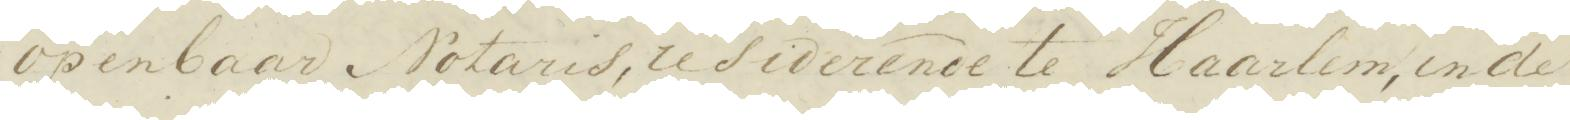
openbaar Notaris, residerende te Haarlem, in de
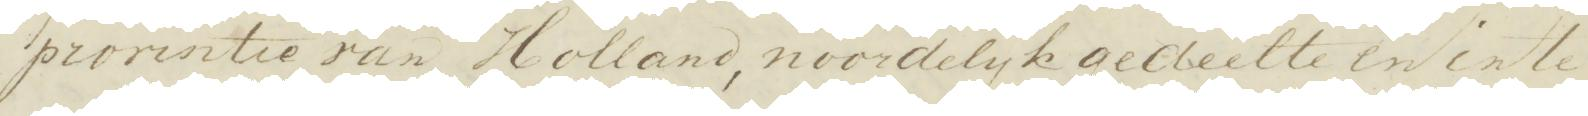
provintie van Holland, noordelijk gedeelte en in te
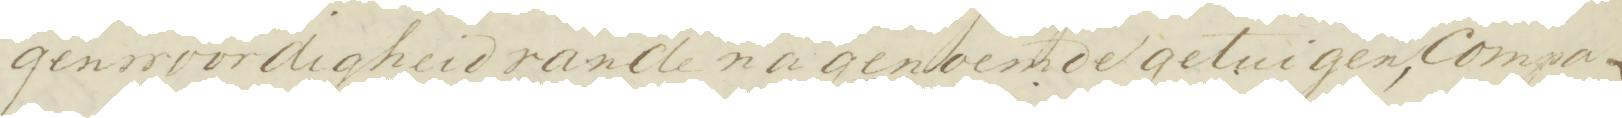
genwoordigheid van de nagenoemde getuigen, Compa
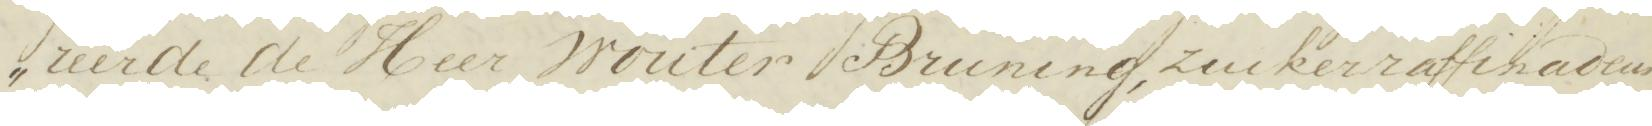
„reerde de Heer Wouter Bruning, zuikerraffinadeur
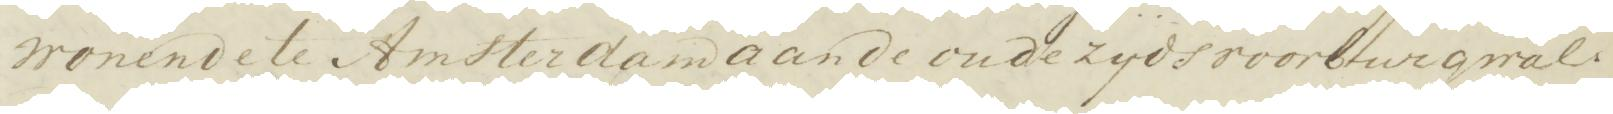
wonende te Amsterdam aan de oude zijds voorburgwal.
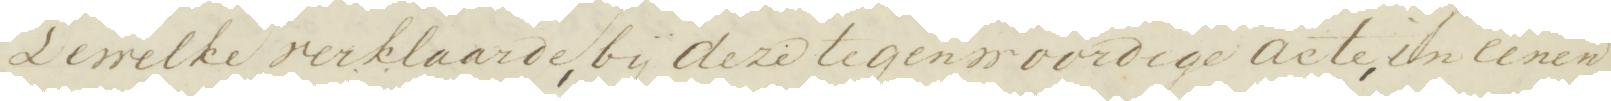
Dewelke verklaarde, bij deze tegenwoordige acte, in eenen
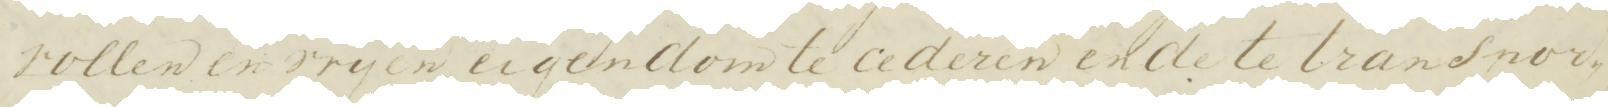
vollen en vryen eigendom te cederen ende te transpor„
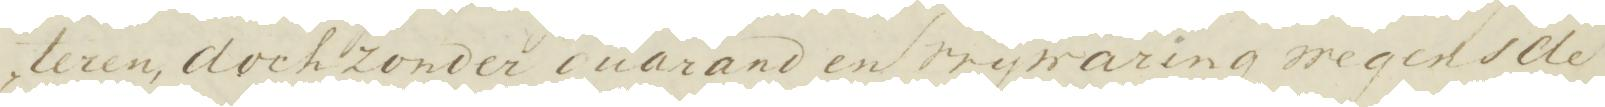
„teren, doch zonder guarand en vrijwaring wegens de
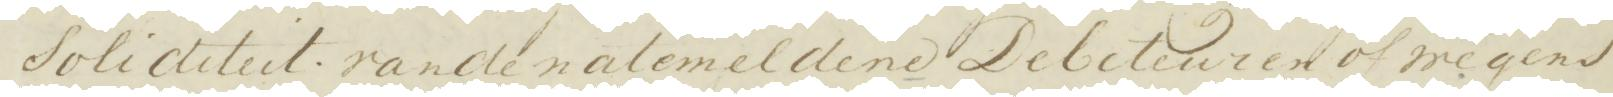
soliditeit van de natemeldene Debiteuren of wegens
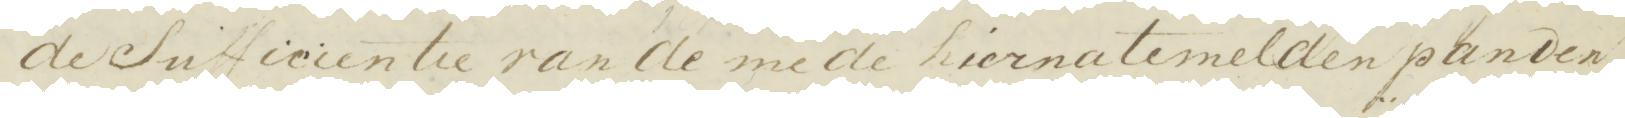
de Sufficientie van de mede hiernatemelden panden
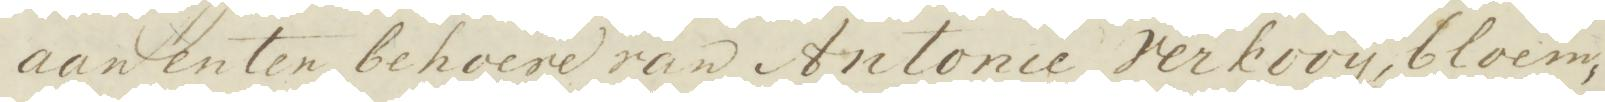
aan en ten behoeve van Antonie Verkooij, bloem„
